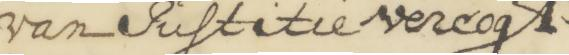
van Iustitie vercogt
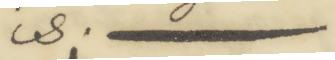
is;
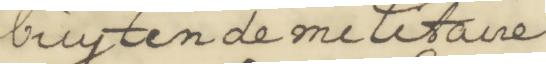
buijten de militaire
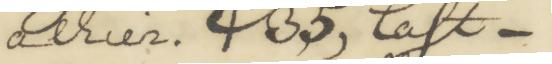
alhier. 435. last —
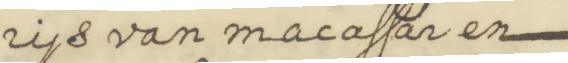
rijs van macassar en
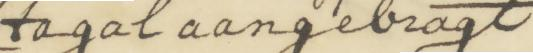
tagal aangebragt
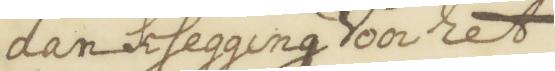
danksegging Voor het
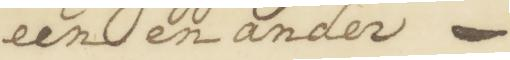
een en ander —
